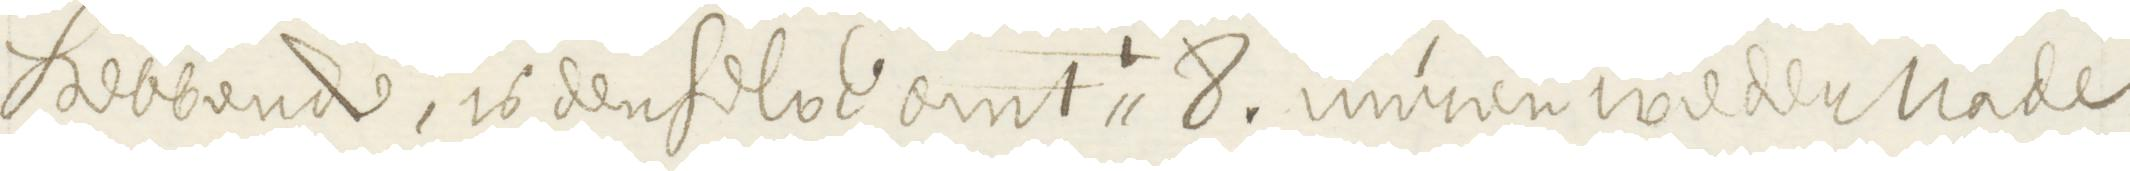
hebbende, is denselve omt„t 8. uuren weder nade
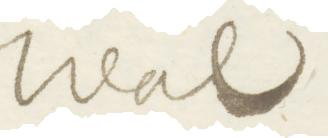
wal
